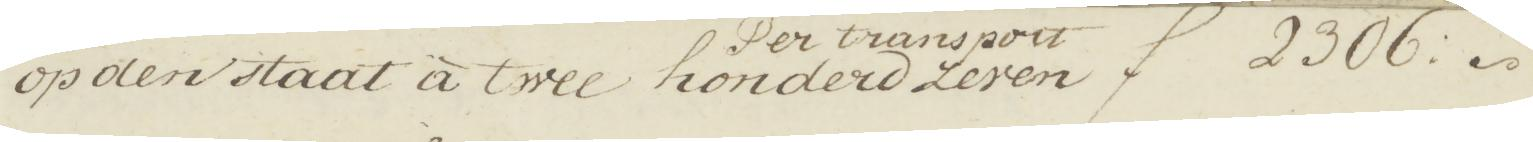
op den staat à twee honderd zeven ƒ 2306: —
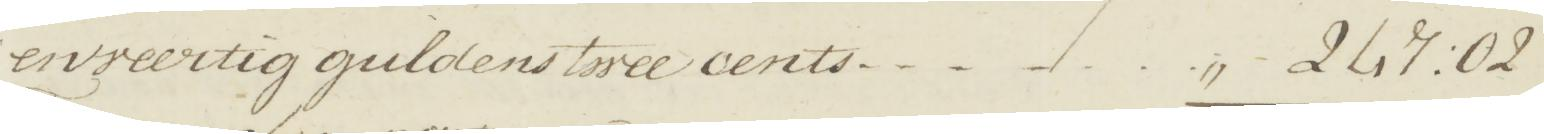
en veertig guldens twee cents. . . . . . . „ 247:02
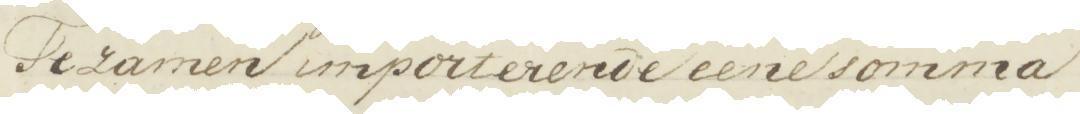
Tezamen importerende eene somma
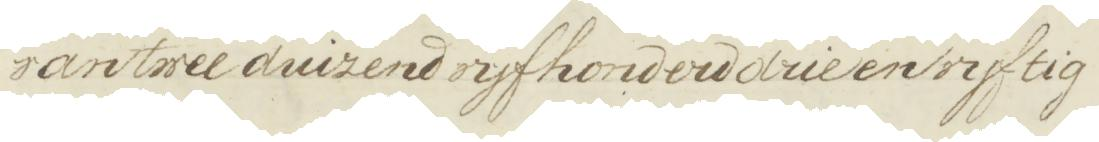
van twee duizend vyfhonderd drie en vyftig
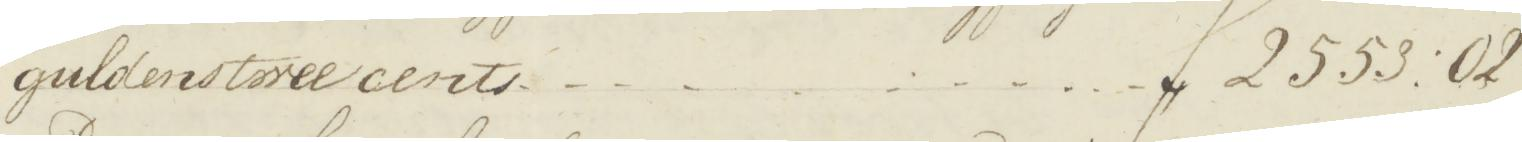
guldens twee cents. . . . . . . . . . . ƒ 2553:02
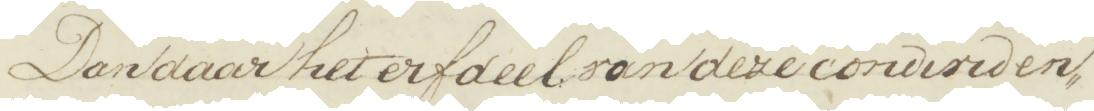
Dan daar het erfdeel van deze condividen„
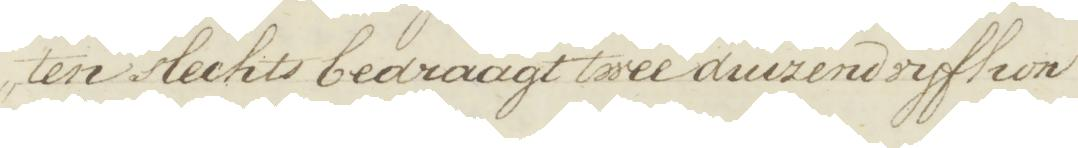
ten slechts bedraagt twee duizend vyfhon
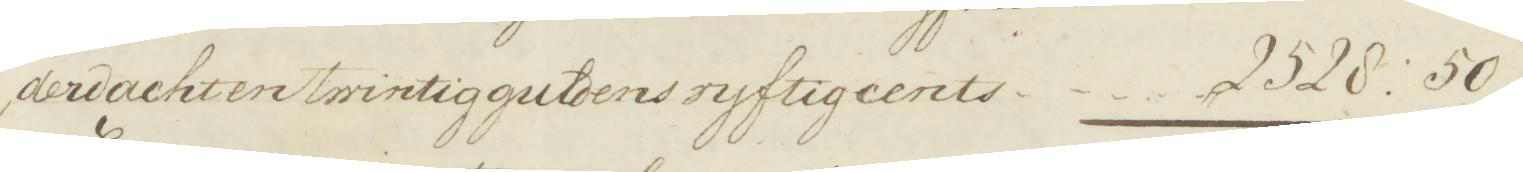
derd acht en twintig guldens vyftig cents. . . . . „2528: 50
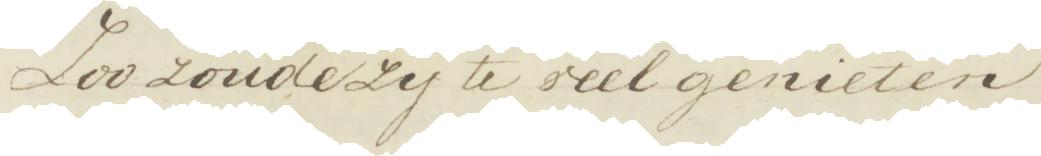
Zoo zoude zy te veel genieten
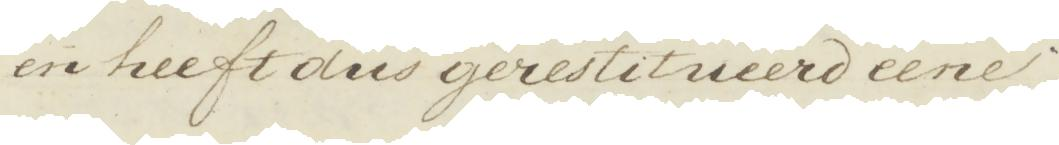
en heeft dus gerestitueerd eene
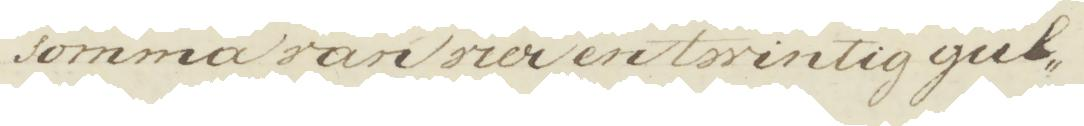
somma van vier en twintig gul„
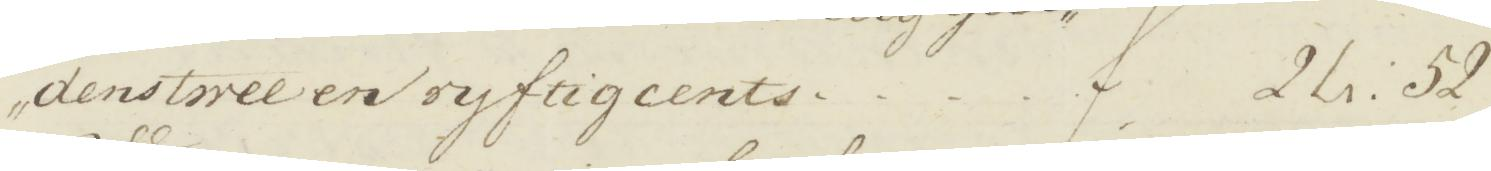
„dens twee en vyftig cents. . . . . ƒ 24:52
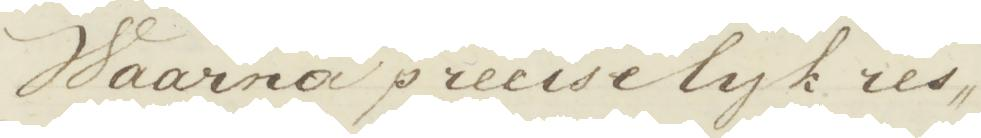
Waarna preciselyk res„
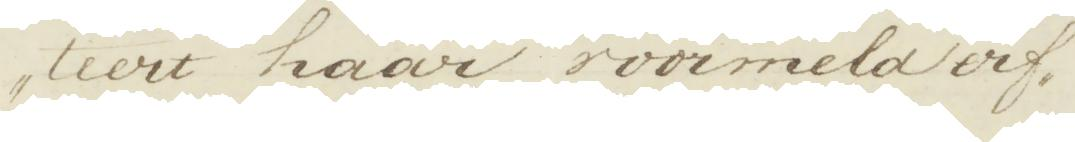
„teert haar voormeld erf„
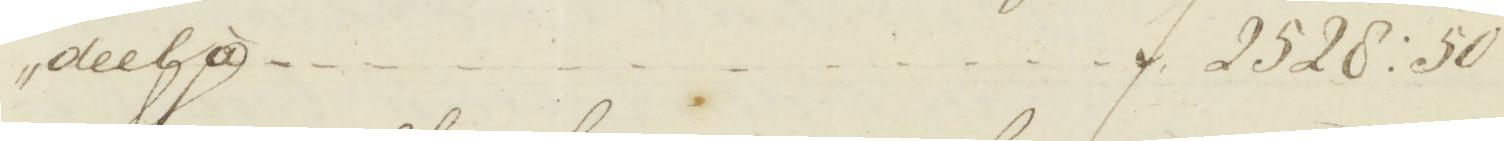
„deel à . . . . . . . . . . . . ƒ 2528:50
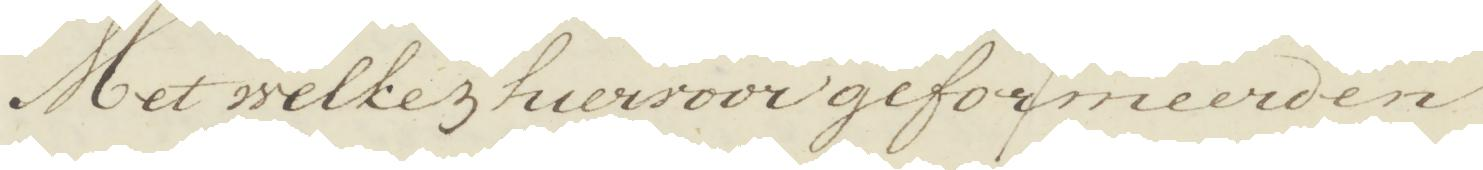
Met welken hiervoor geformeerden
